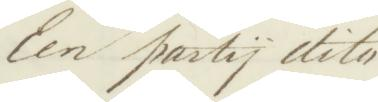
Een partij dito
